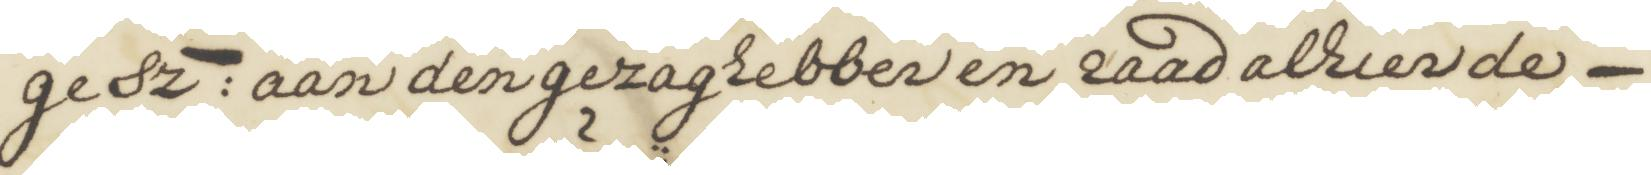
gesz: aan den gezaghebber en raad alhier de —
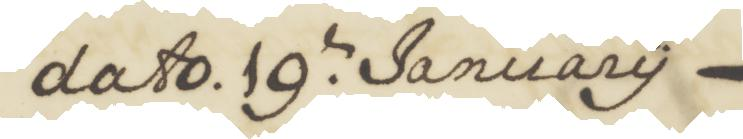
dato. 19.en Ianuarij —
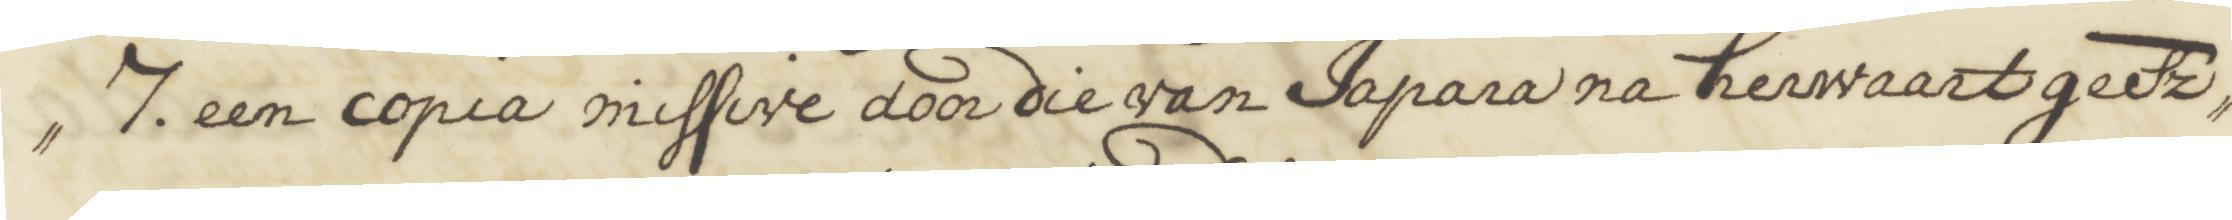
„ 7. een copia missive door die van Iapara na herwaart gesz„
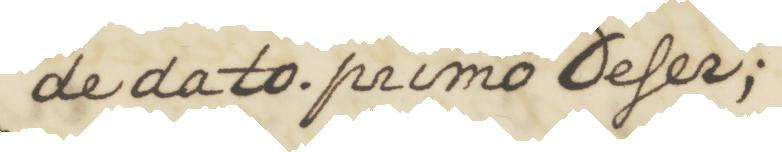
de dato. primo deser;
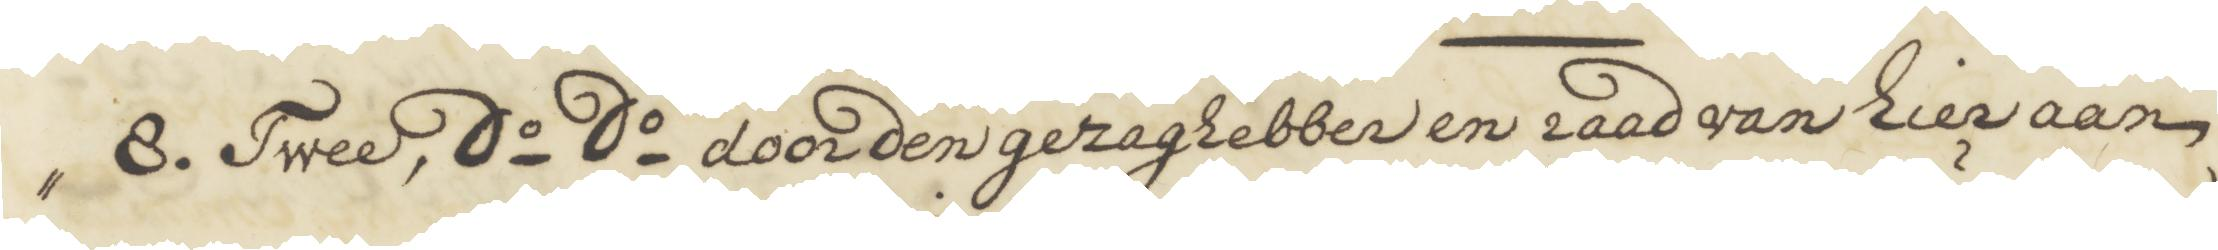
„ 8. Twee, d_o d_o door den gezaghebber en raad van hier aan
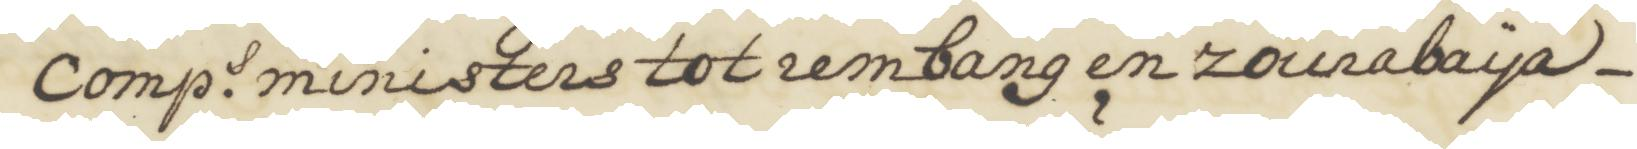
comp.s ministers tot rembang en zourabaija _
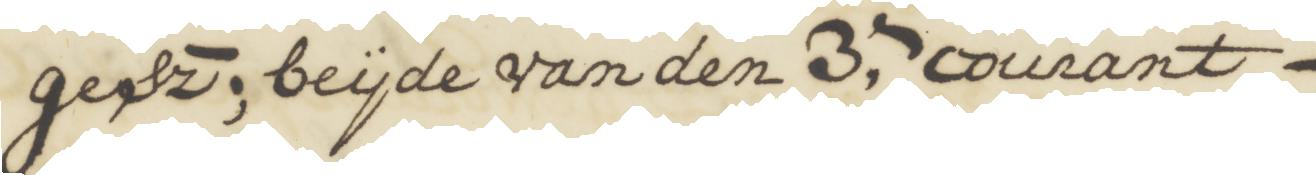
gesz; beijde van den 3,en courant, —
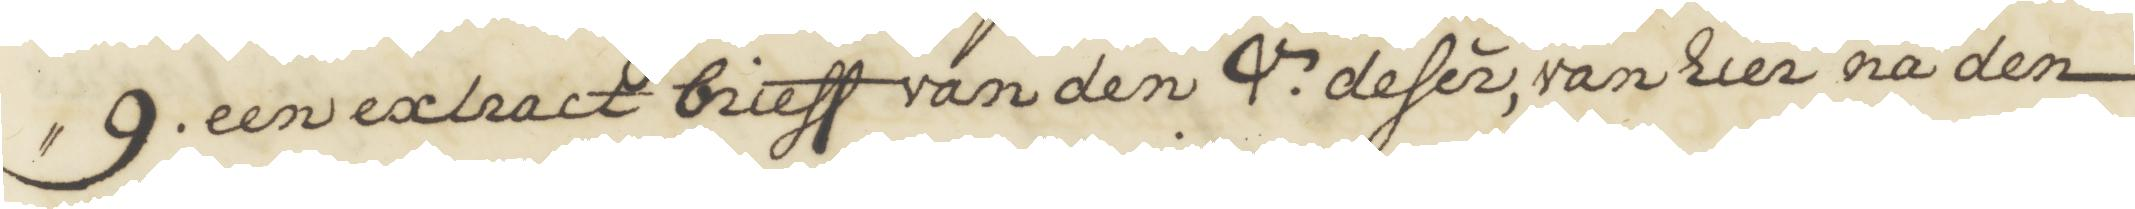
„ 9. een extract brieff van den 4.en deser, van hier na den
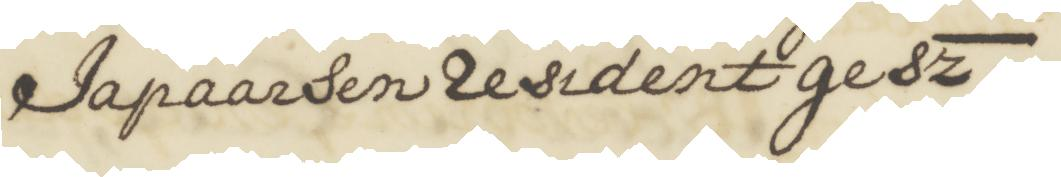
Iapaarsen resident gesz;
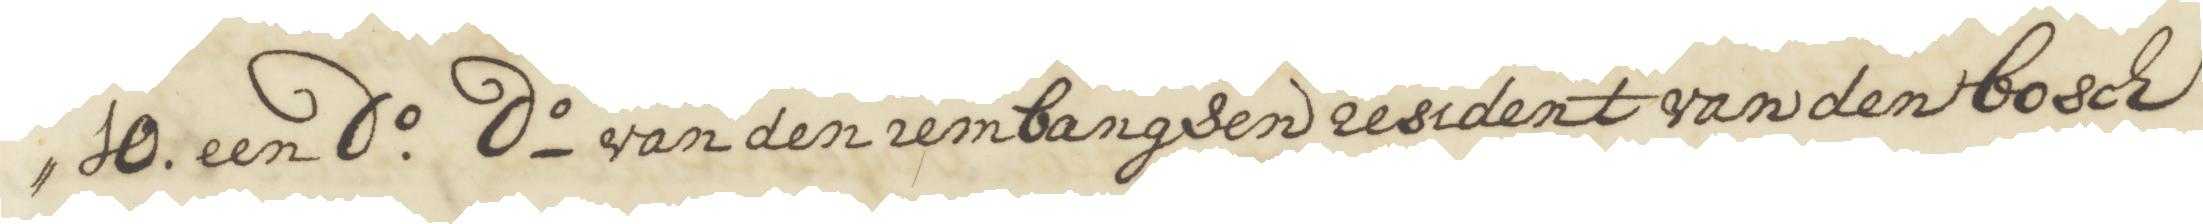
„ 10. een d.o d_o van den rembangsen resident van den bosch
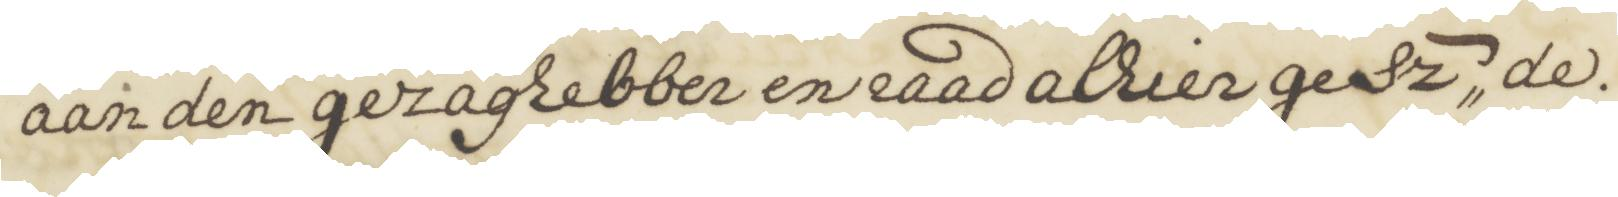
aan den gezaghebber en raad alhier gesz„ de.
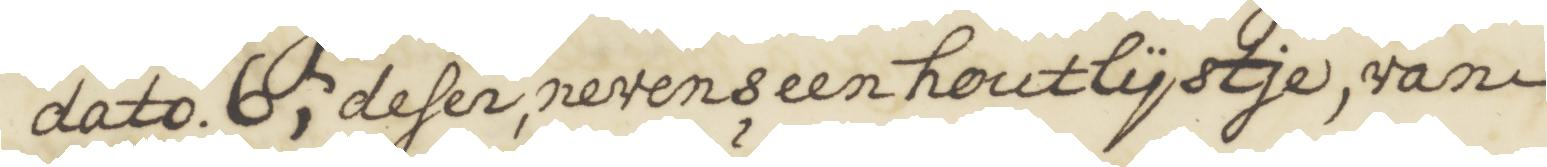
dato. 6,en deser, nevens een houtlijstje, van
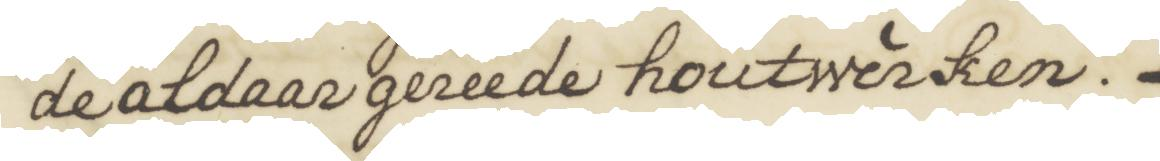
de aldaar gereede houtwerken.
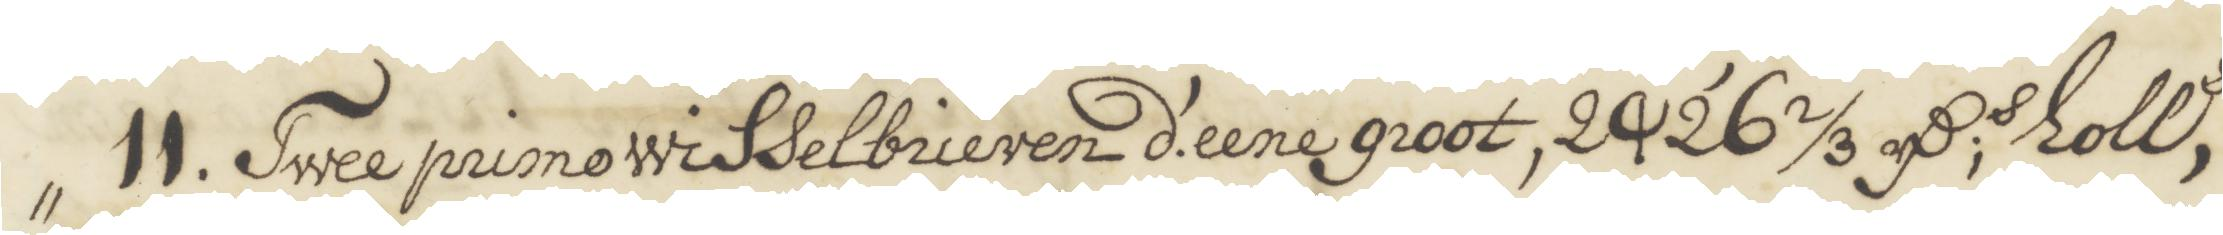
„ 11. Twee primo wisselbrieven d.' eene groot, 2426 2/3 rp;s holl,s
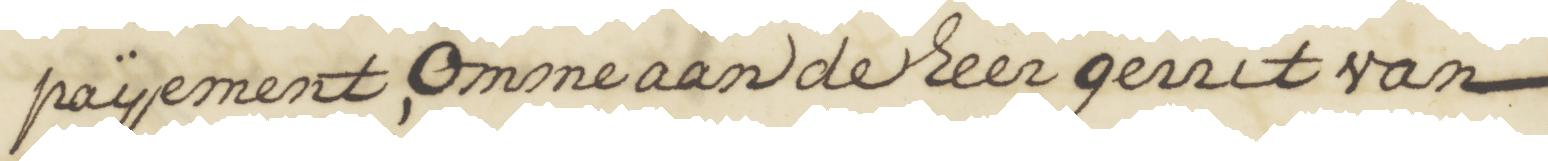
paijement, Omme aan de heer gerrit van
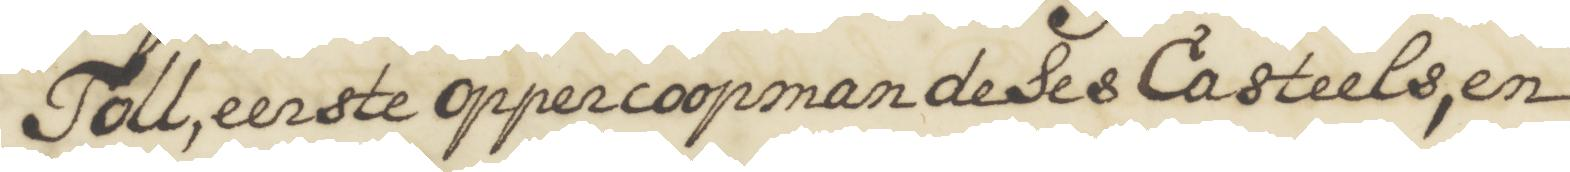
Toll, eerste oppercoopman deses Casteels, en
